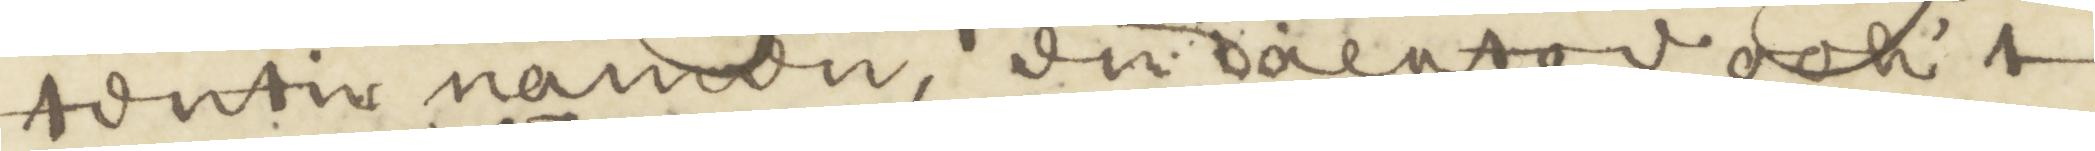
tentie namen, en daertoe ook ’t
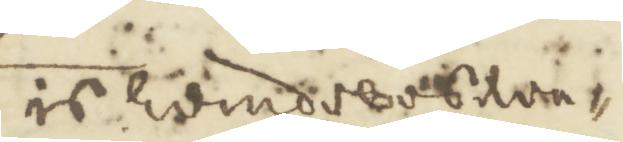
is hem de besten„
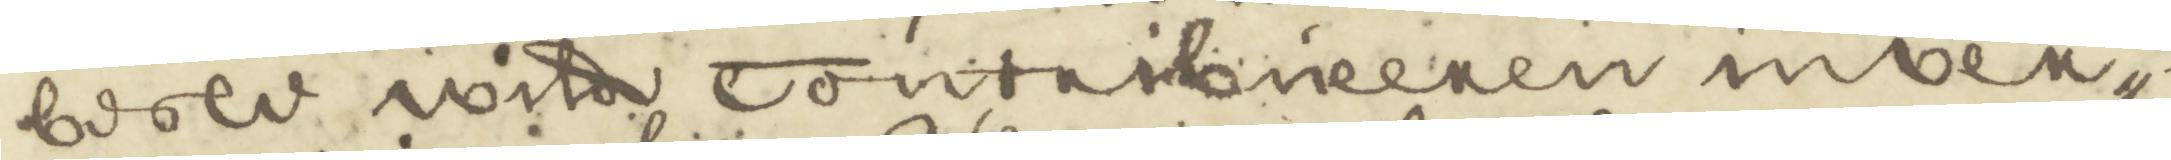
beste wilde contribueeren in ver
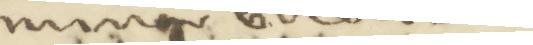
minge belooft.
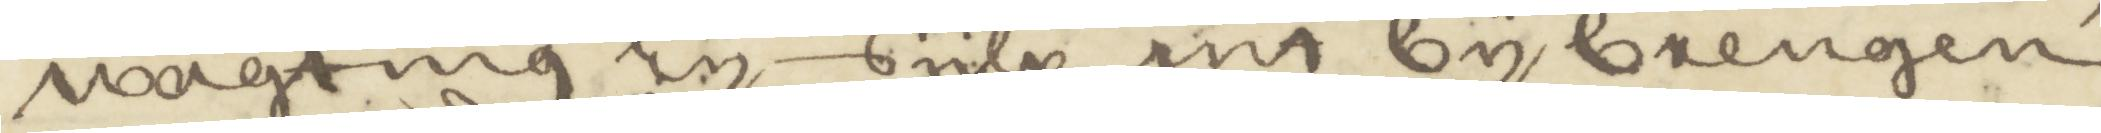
wagting hij sulx int bij brengen
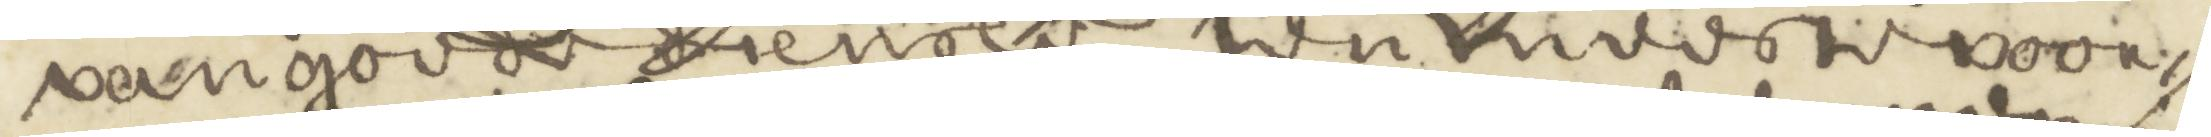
van goede dienste ten meeste voor„
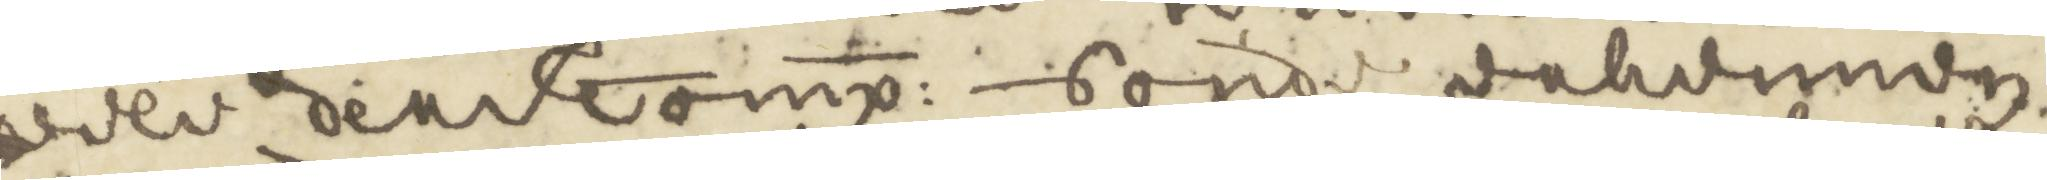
deele der Ecomp: soude erkennen
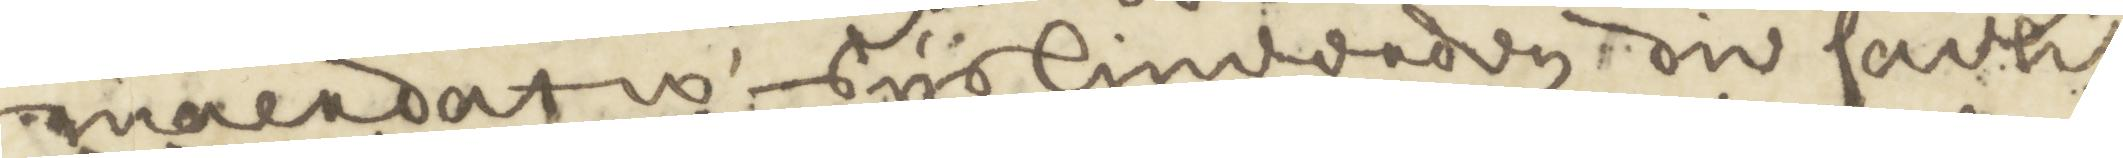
maer dat w' sustineerden, die saek
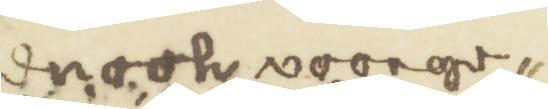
en ook voorge„
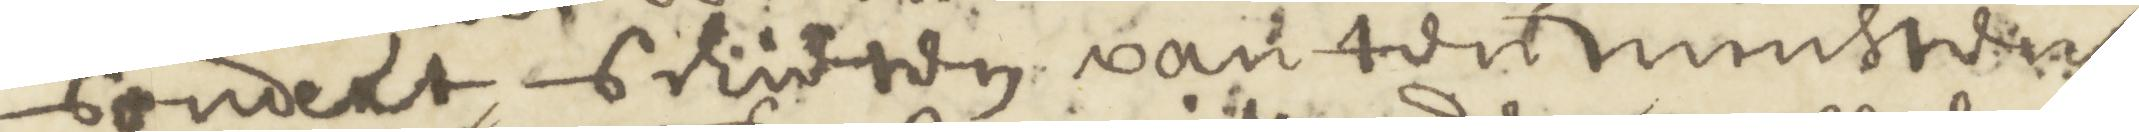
sonder't schieten van ten minsten
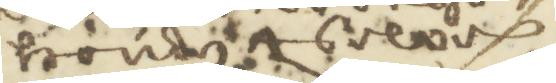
houden t selve
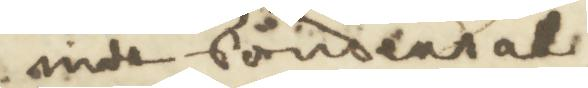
niet sondert al
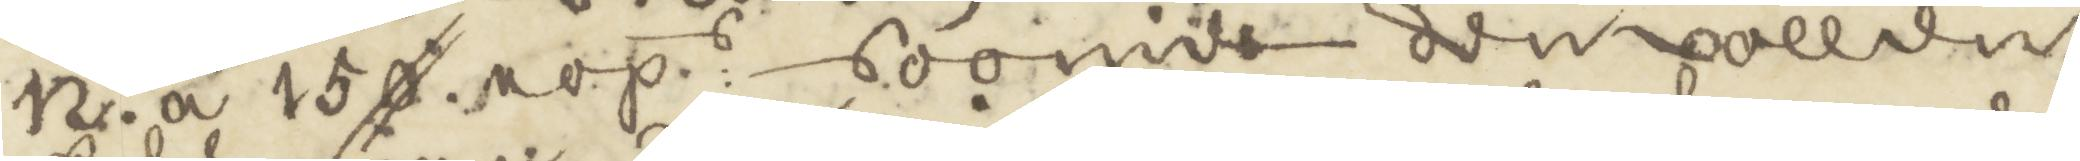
12. â 15 Ø. rop:s soo niet den vollen
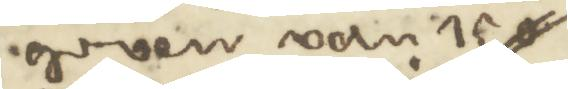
geven van 15 Ø
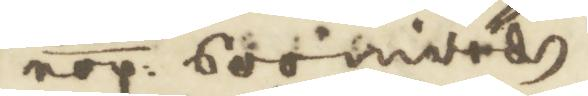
rop: soo niet den
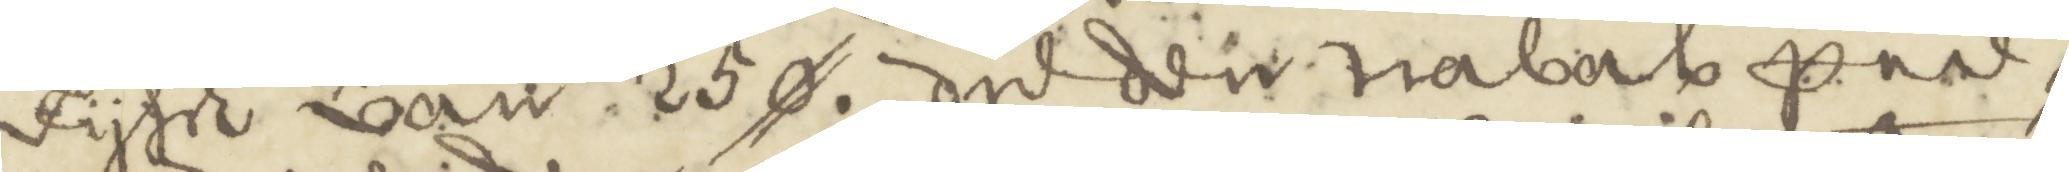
Eijsch van 25 Ø. die den nabab pre„
